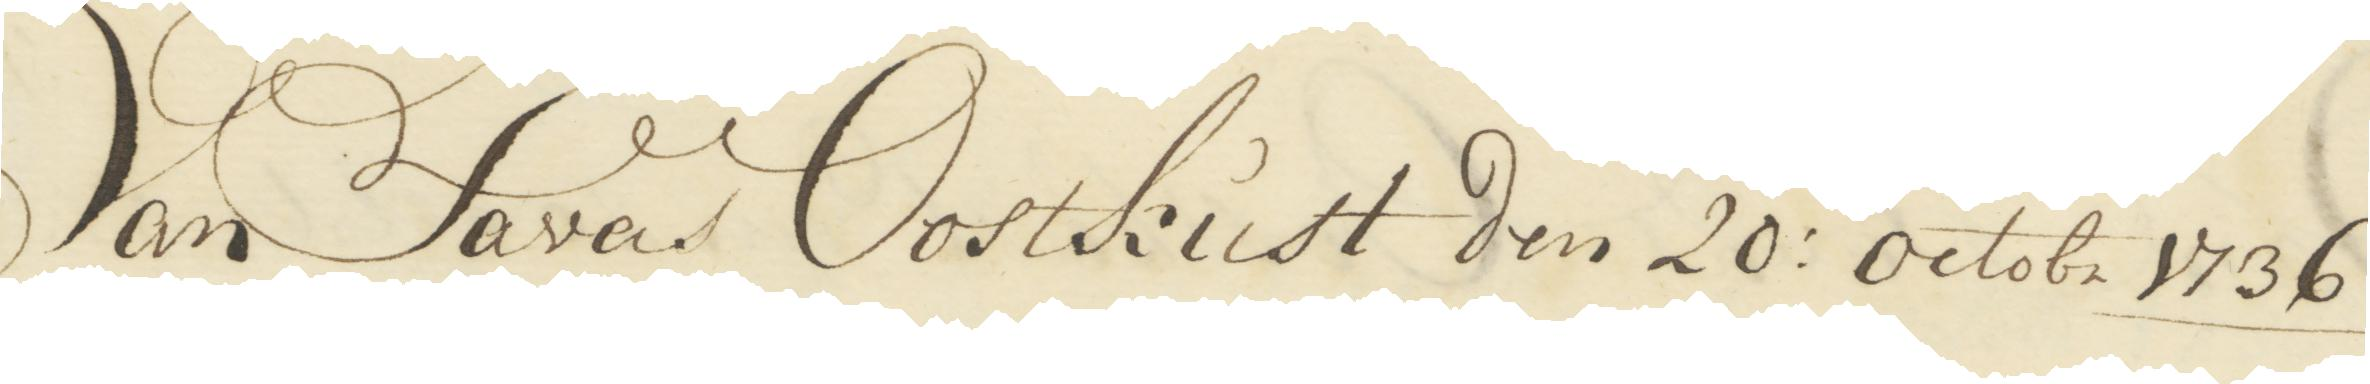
Van Iavas Oostkust den 20: octobr 1736
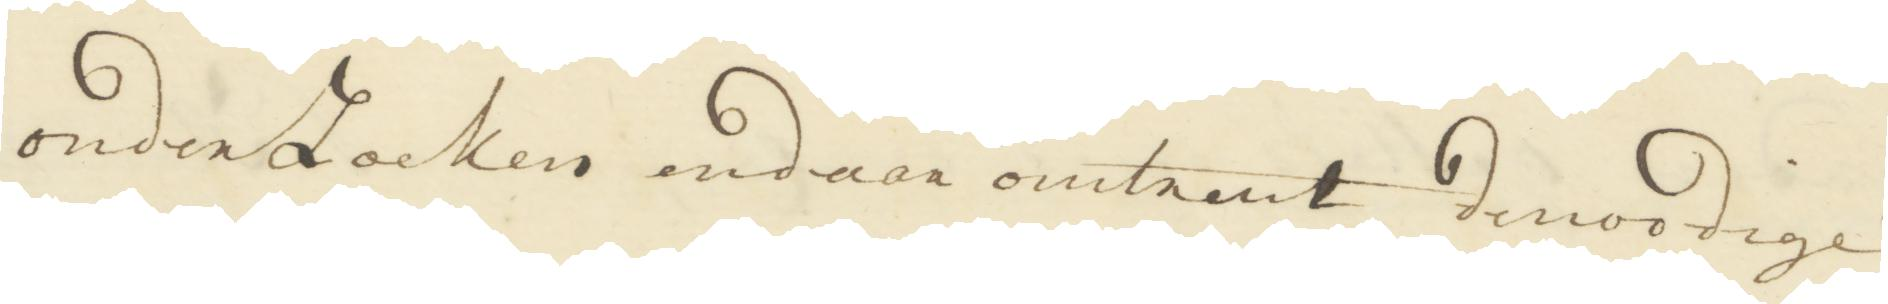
onderzoeken endaar omtrent denoodige
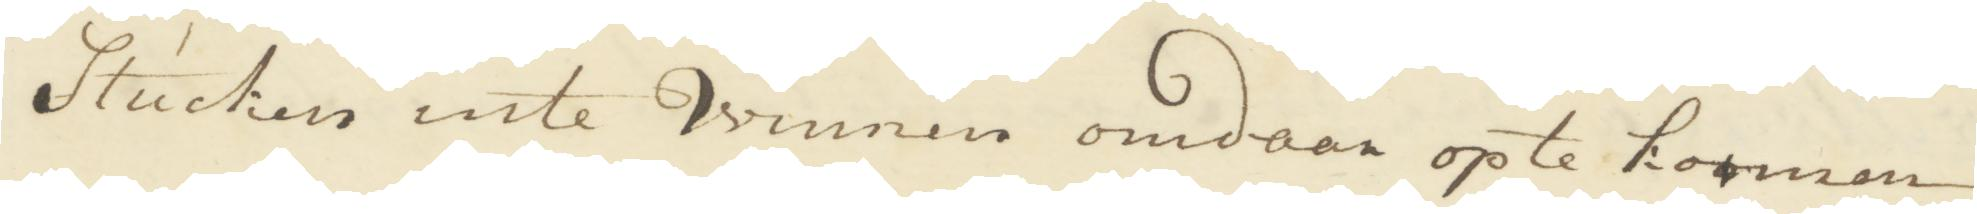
stucken inte winnen omdaar op te koomen
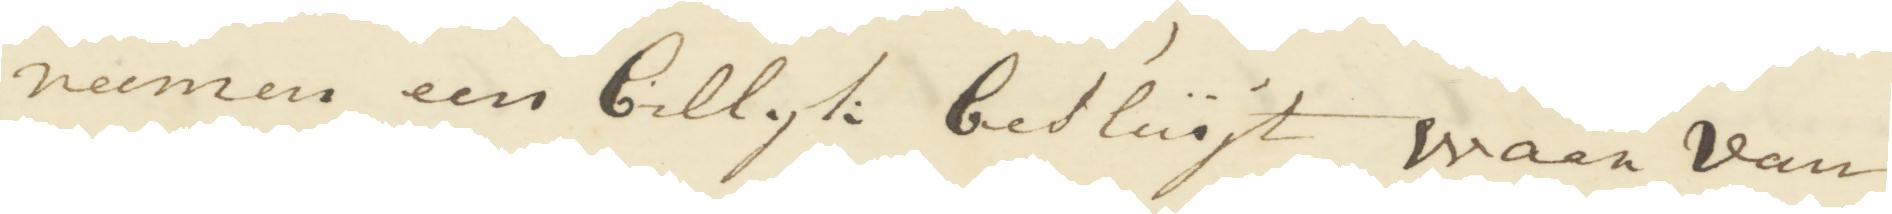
neemen een billijk besluijt waar van
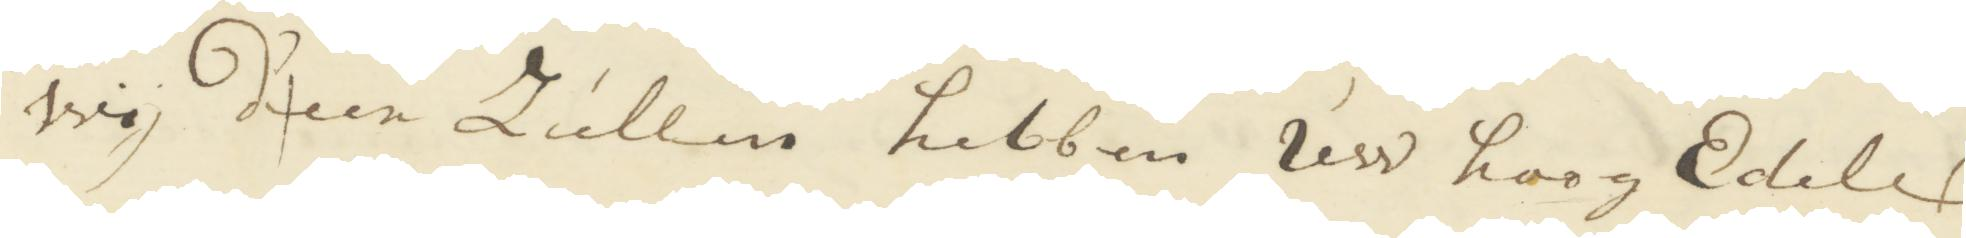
wij d' eer zullen hebben uw hoog Edele
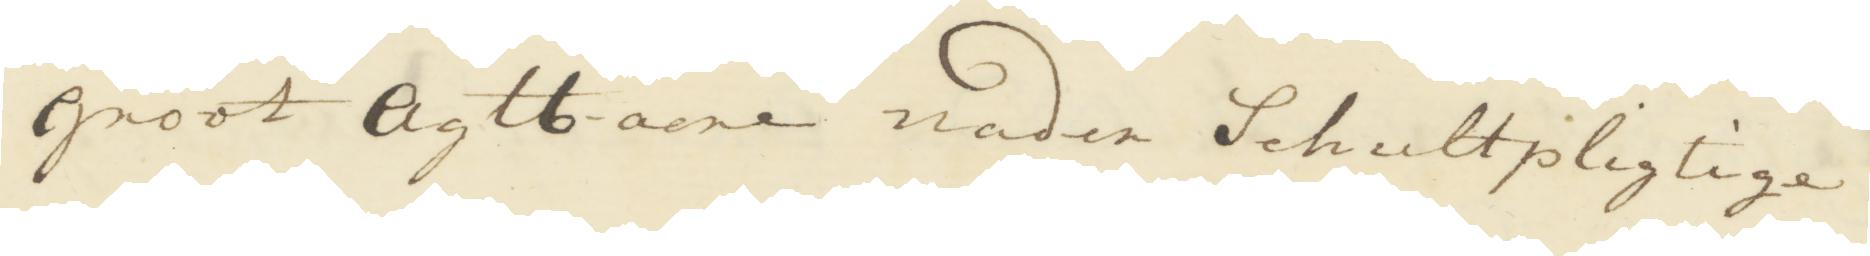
groot agtbaere nader schultpligtige
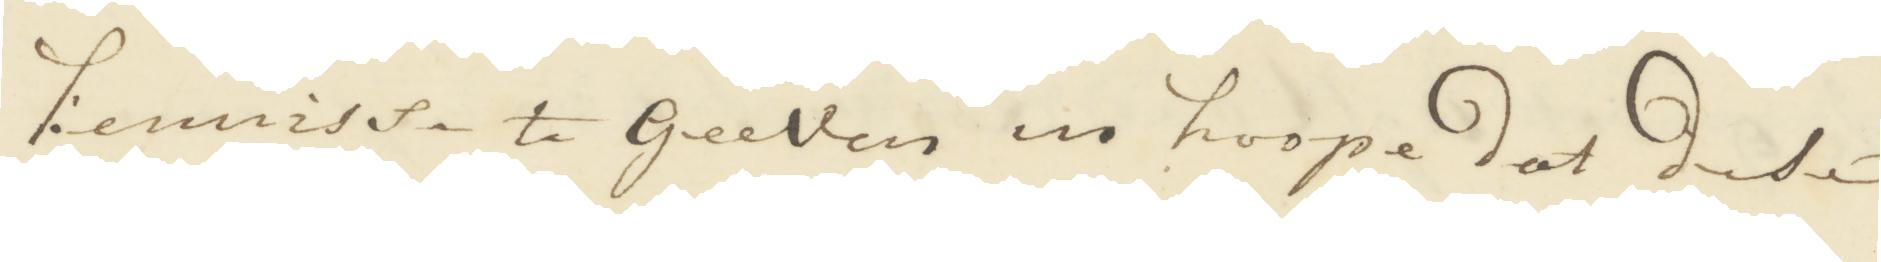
kennisse te geeven in hoope dat dese
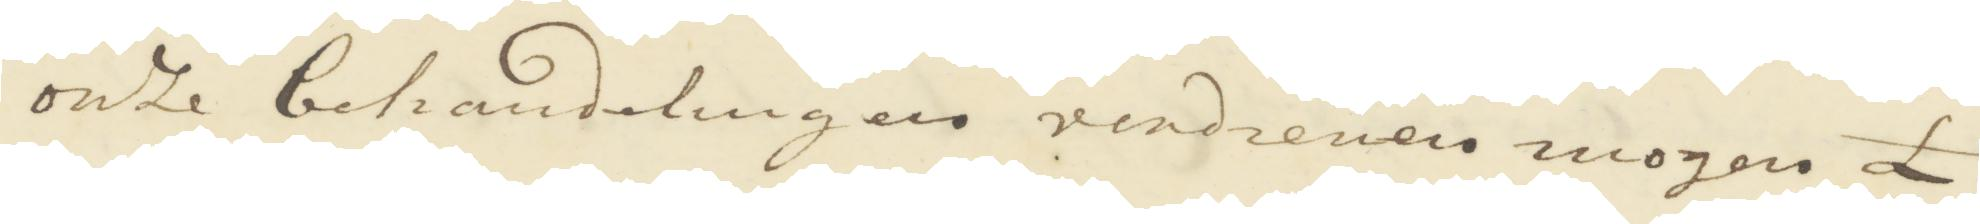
onze behandelingen verdienen mogen t
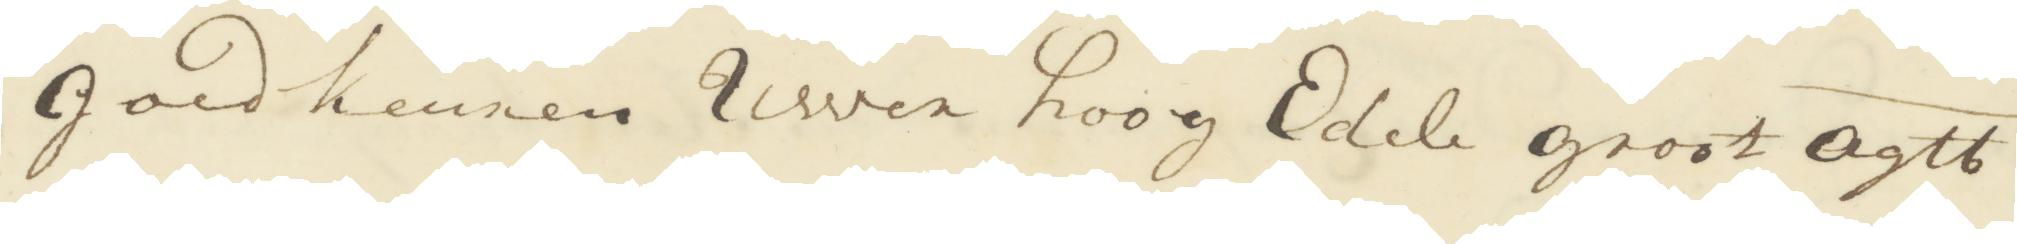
goedkeuren uwer hoog Edele groot agtb
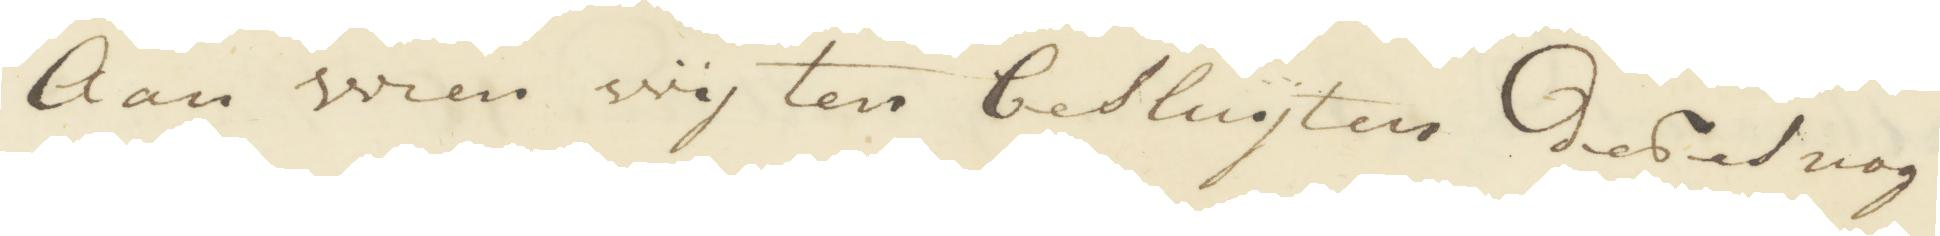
Aan wien wij ten besluijten deses nog
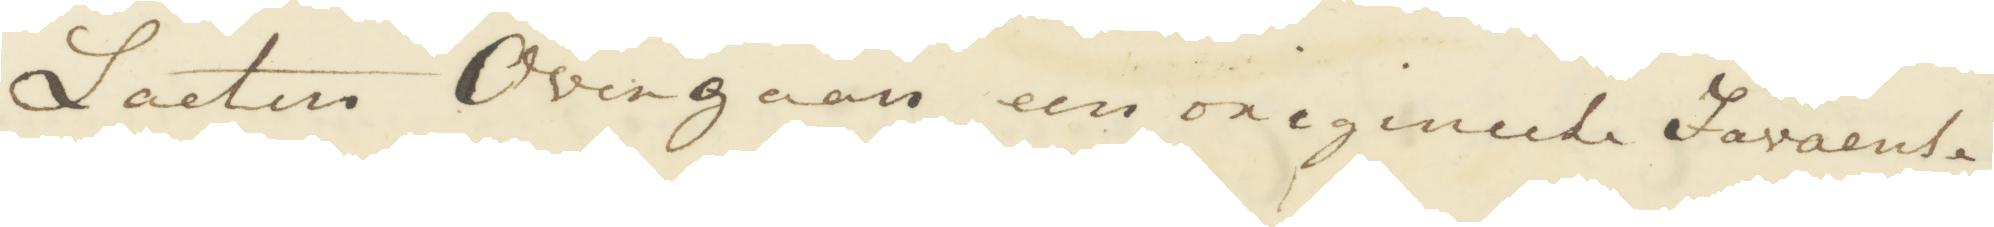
Laeten Overgaan een origineese Iavaense
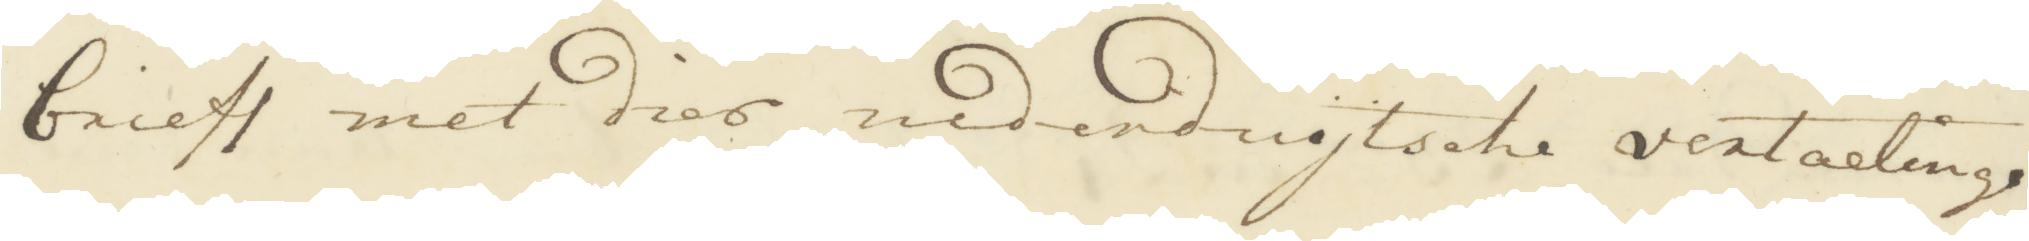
brieff met dier nederduijtsche vertaelinge
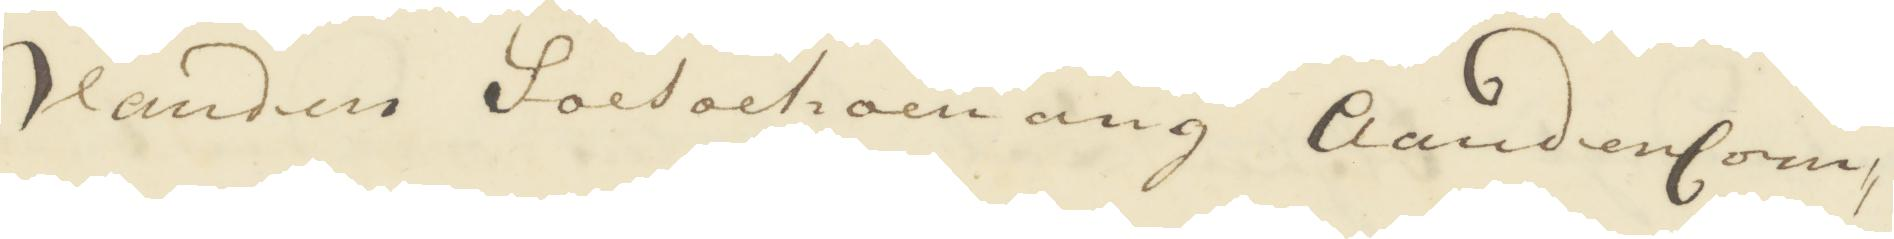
vanden soesoehoenang aandencom„
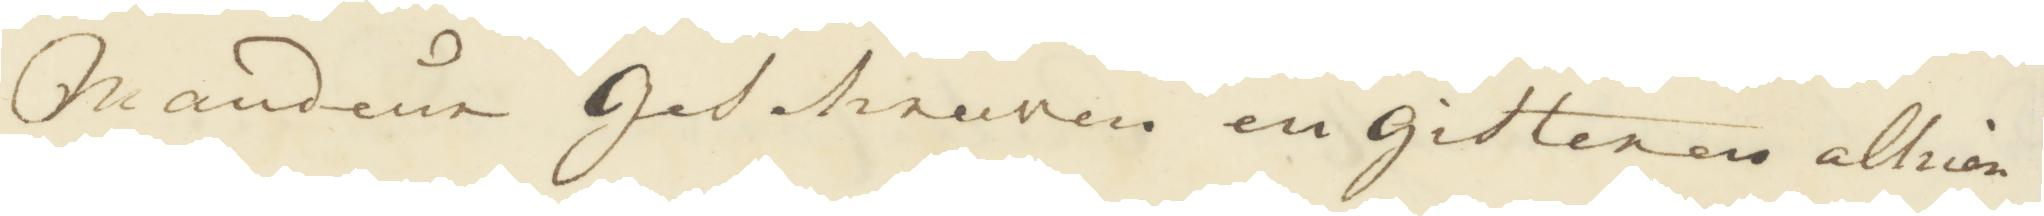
mandeur geschreeven en gisteren alhier
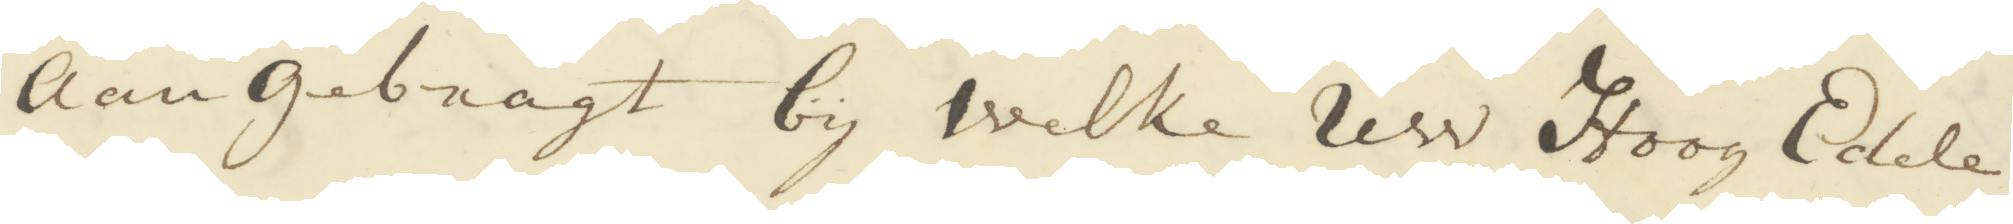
aan gebragt bij welke uw Hoog Edele
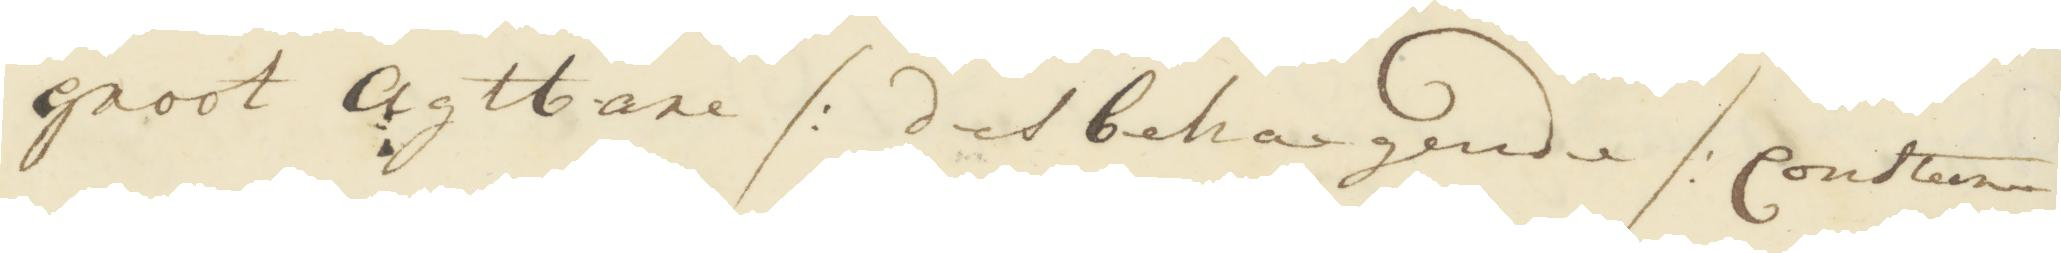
groot agtbare /: des behaegende /: Consteen
